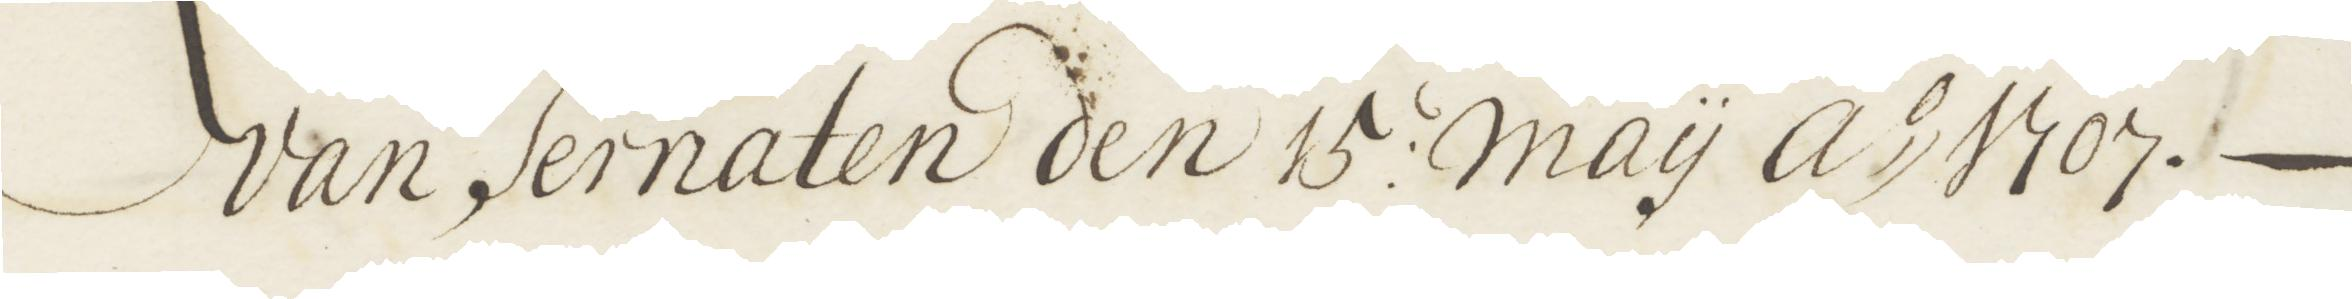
Van Ternaten den 15:' maij A„o 1707.—
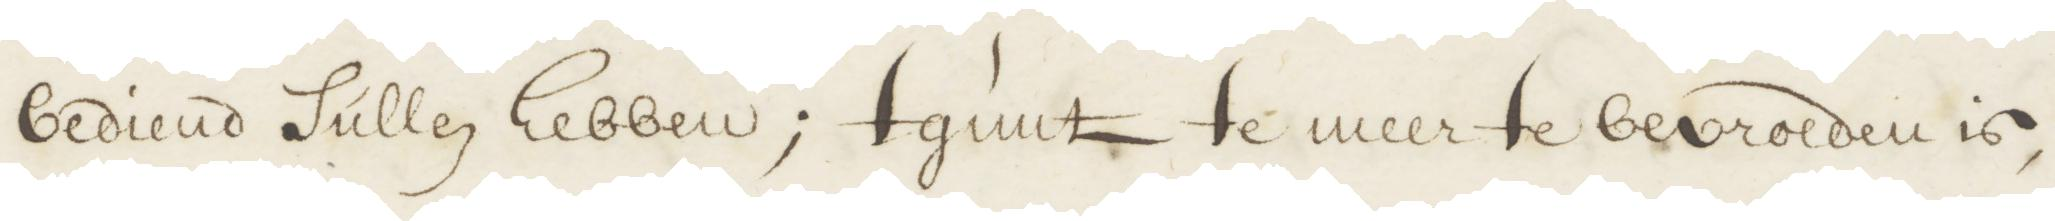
bediend sullen hebben; tgunt te meer te bevroeden is,
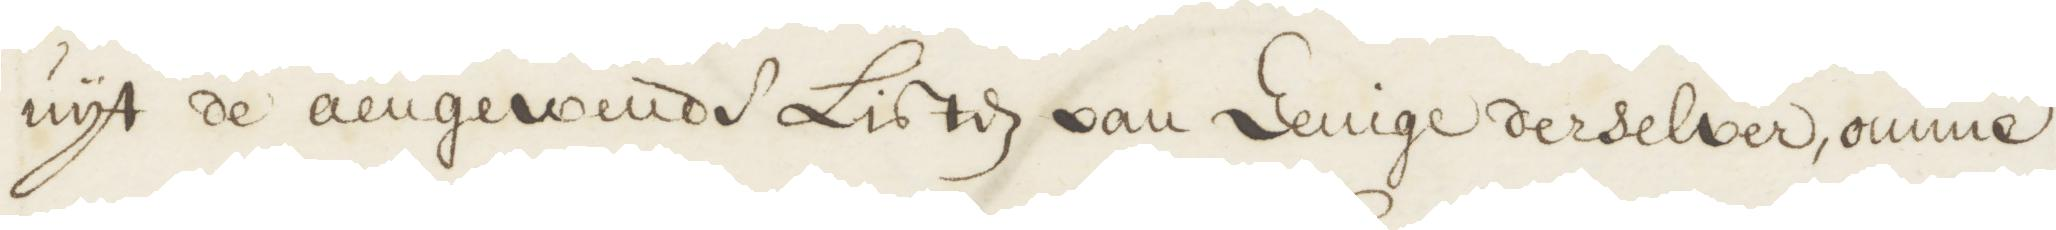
uijt de aengewende listen van Eenige derselver, omme
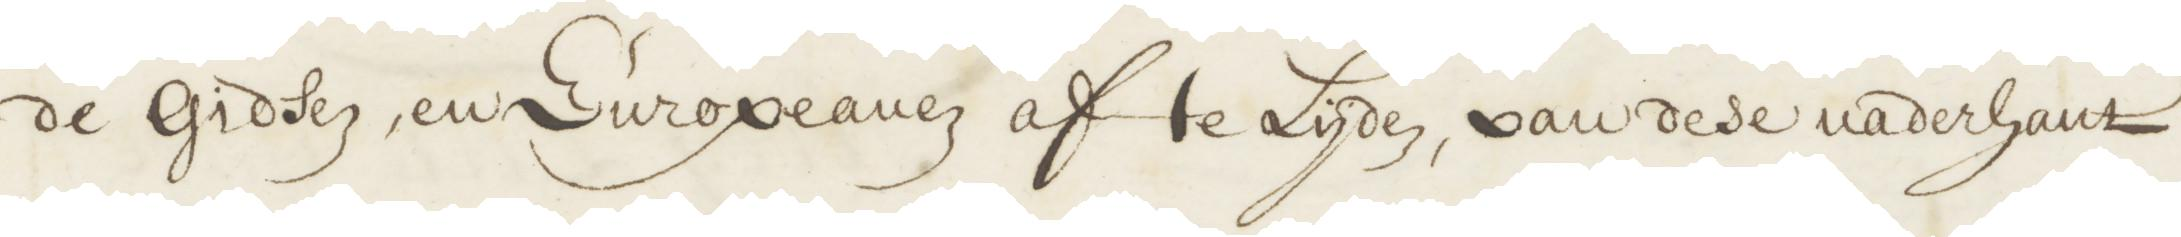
de gidsen, en Europeanen af te lijden, van dese naderhant
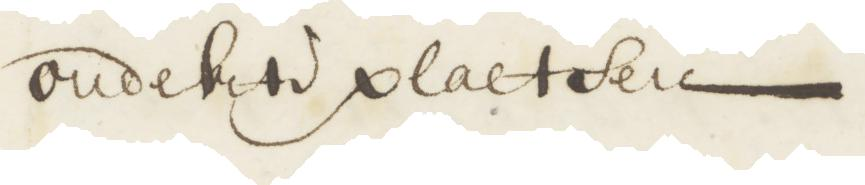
ondekte plaetsen
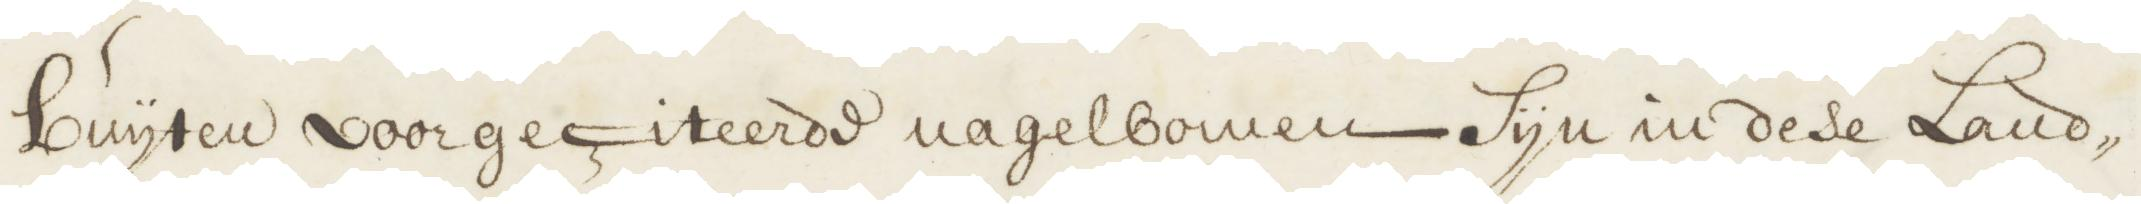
buijten voorgeçiteerde nagelbomen sijn in dese land„
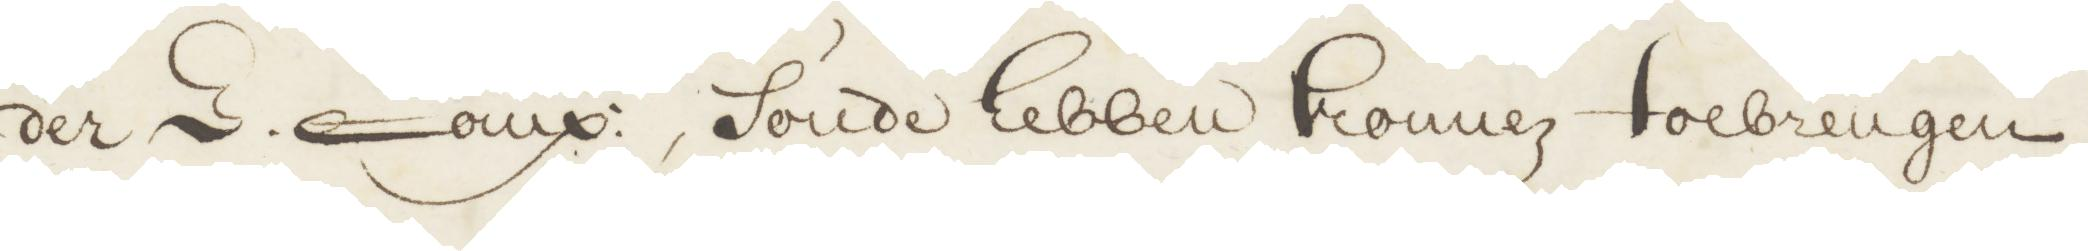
der E. Comp:, soude hebben konnen toebrengen
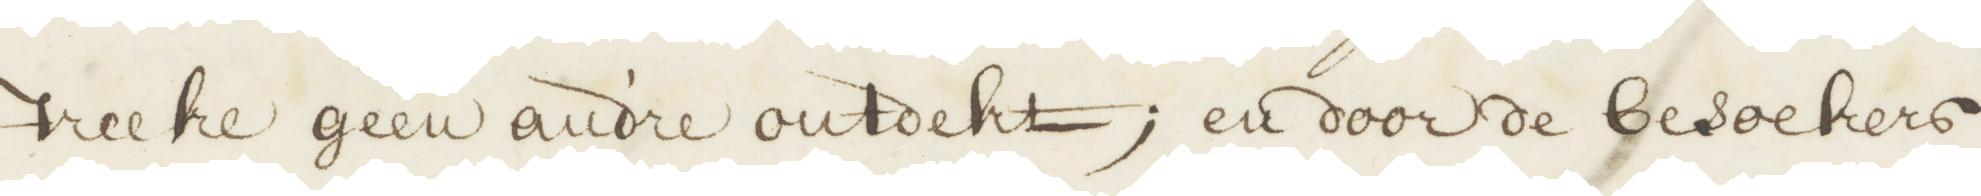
streeke geen andre ontdekt; en door de besoekers
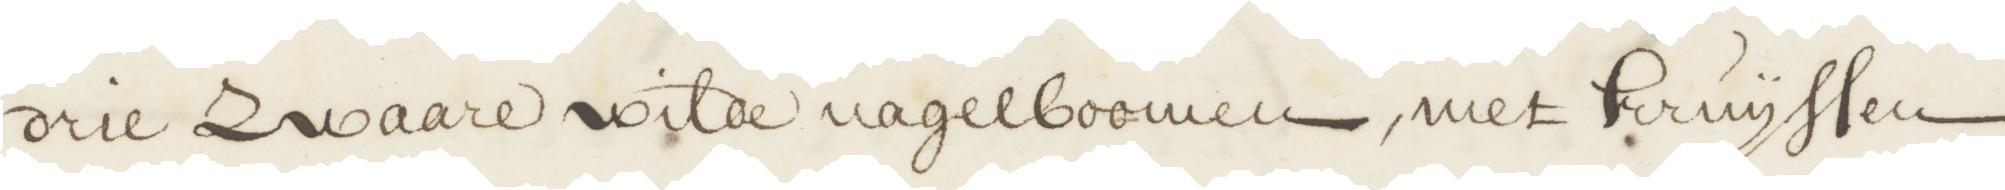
drie zwaare wilde nagelboomen, met kruijssen
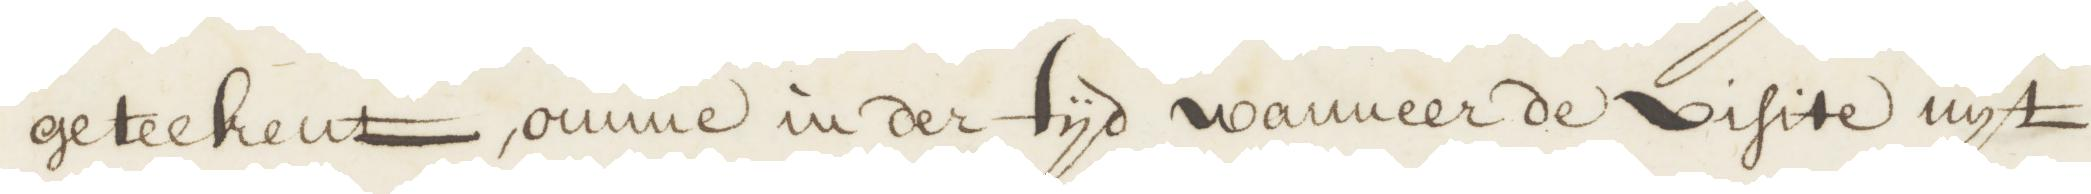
geteekent, omme in der tijd wanneer de visite uijt
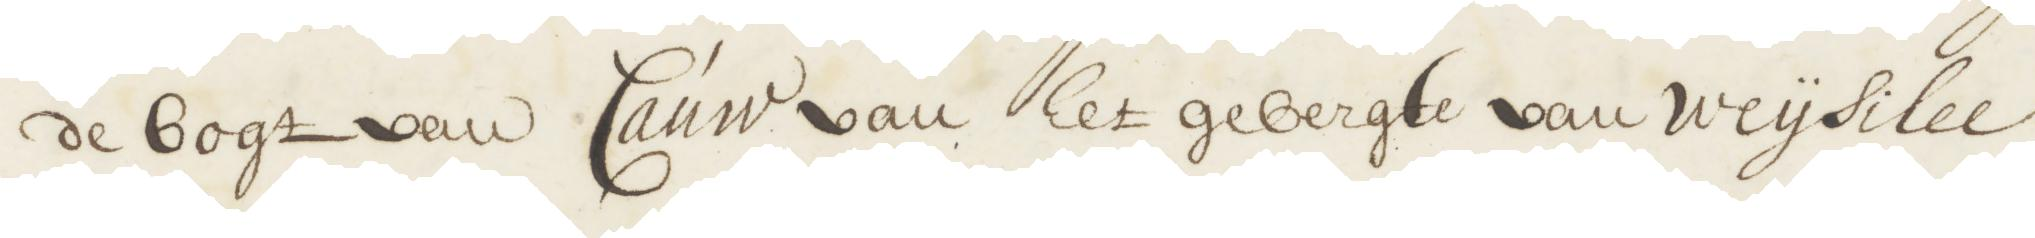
de bogt van Cauw van het gebergte van weijsilee
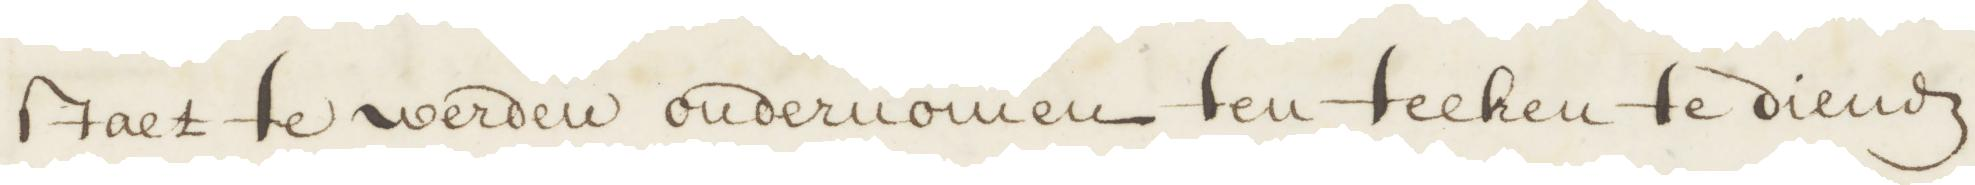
staet te werden ondernomen ten teeken te dienen,
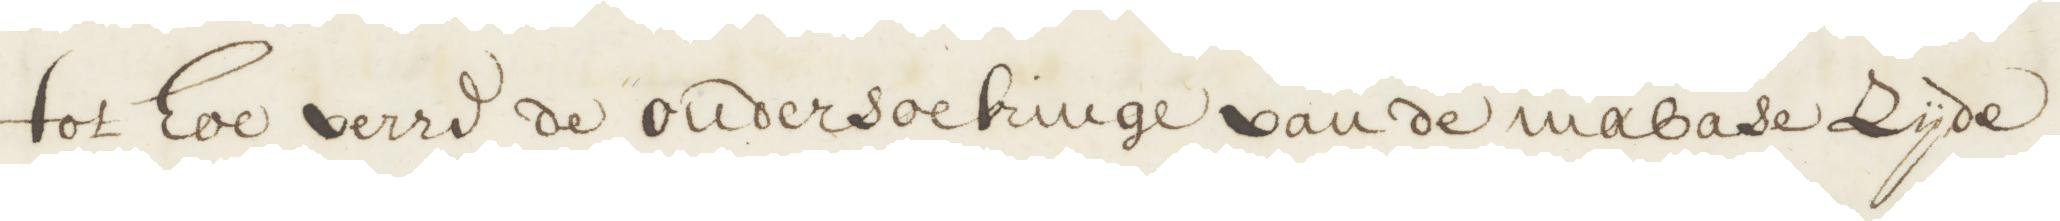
tot hoe verre de ondersoekinge van de mabase zijde
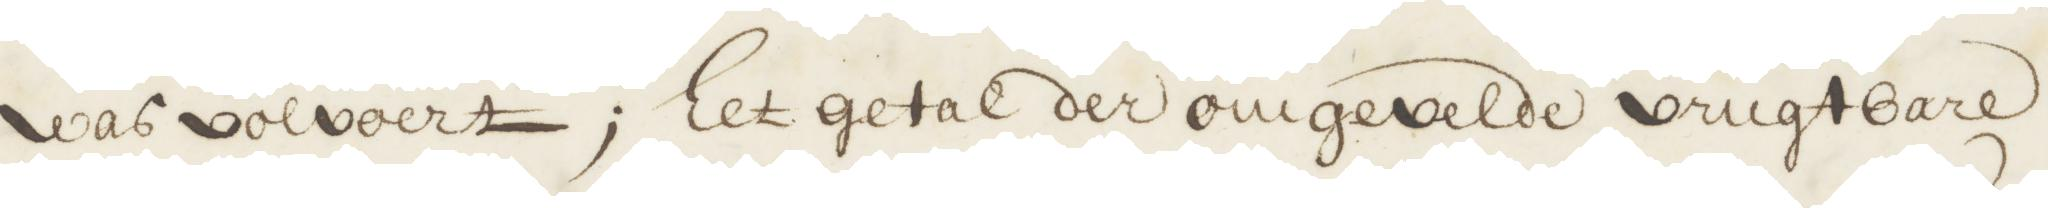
was volvoert; het getal der omgevelde vrugtbare
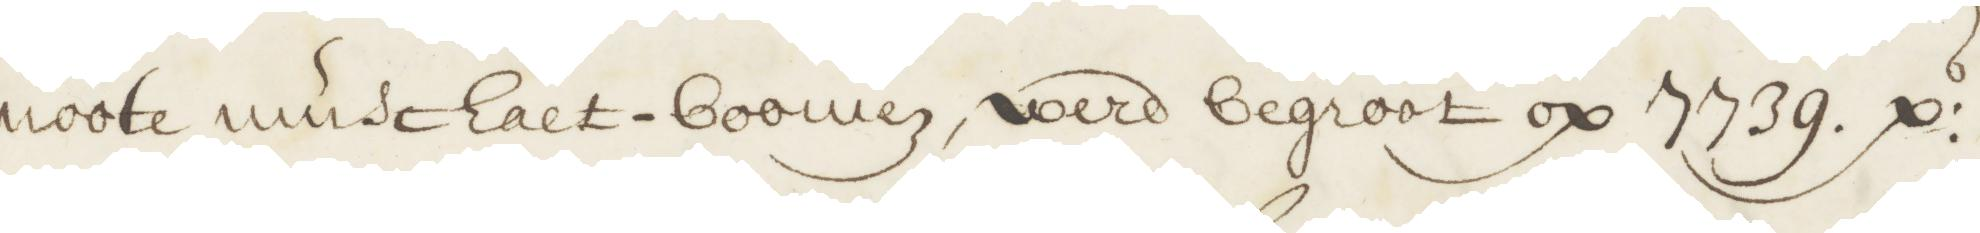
noote muschaet-boomen, werd begroot op 7739. p.s
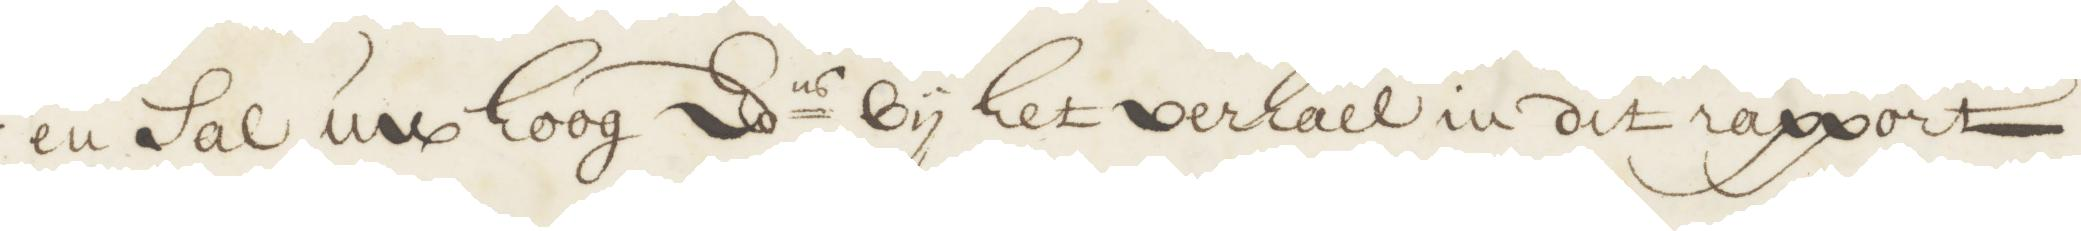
en sal uw hoog Ed=ns bij het verhael in dit rapport
